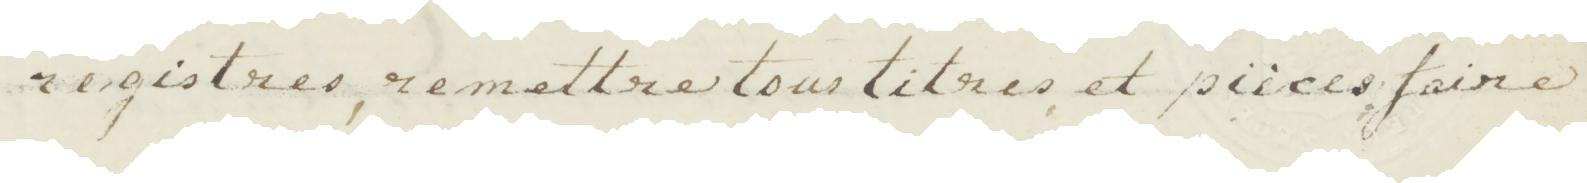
registres, remettre tous titres et pieces faire
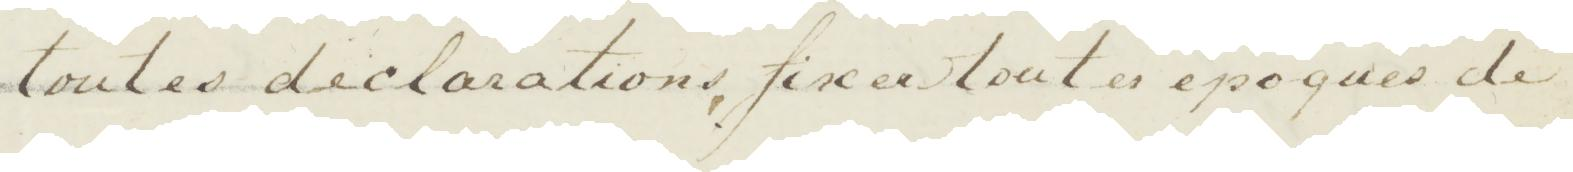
toutes declarations, fiscer toutes epoques de
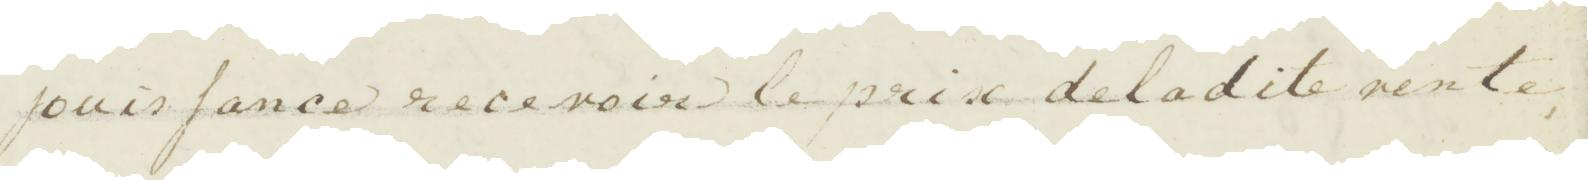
puis sance recevoir le prix deladite vente„
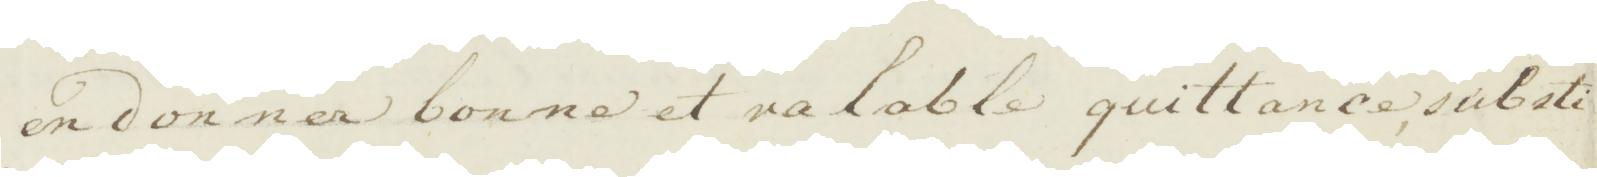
en donner bonne et valable quittance, substi
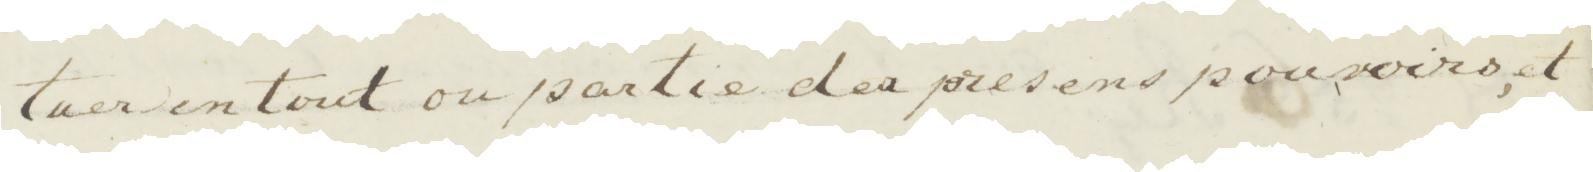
tuer en tout ou partie de presens pouvoirs, et
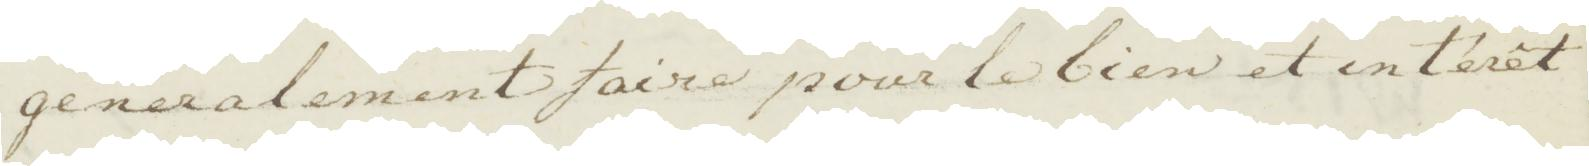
generalement faire pour le bien et en térêt
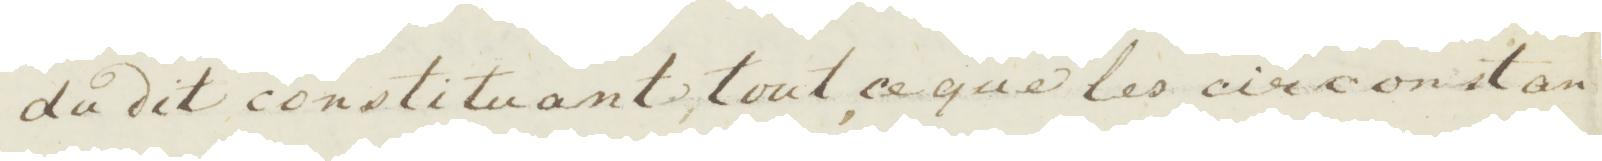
du dit constituant, tout, ce que les circonstan
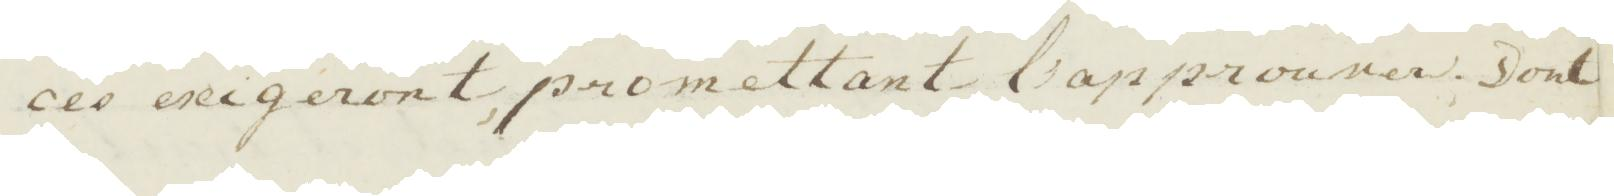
ces eseigeront, promettant- l'approuver. Dont
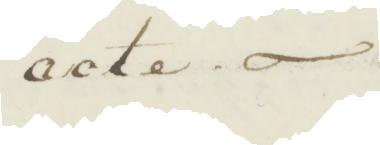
acte. —
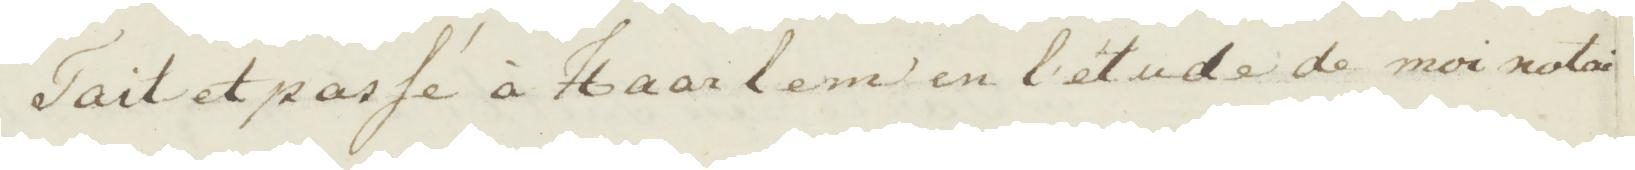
Tait- et passé à Haarlem en l'étude de moi notai
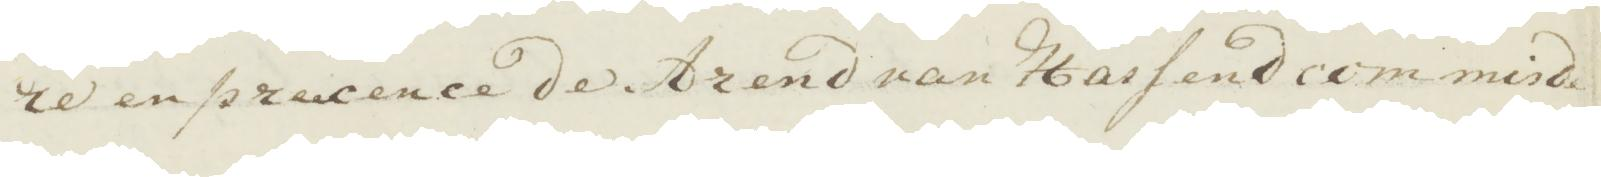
re en prescence de Arend van Hassend commis de
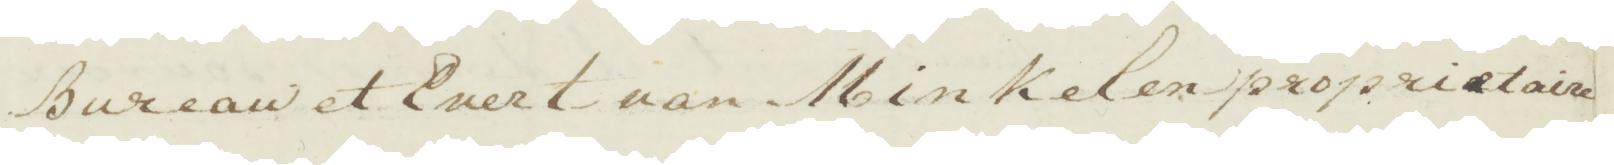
Bureau et Evert van Minkelen proprietaire
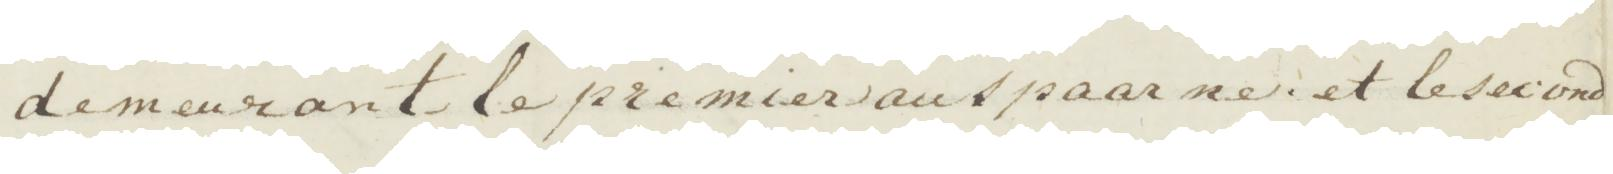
de meurant le premier au spaarne et le second
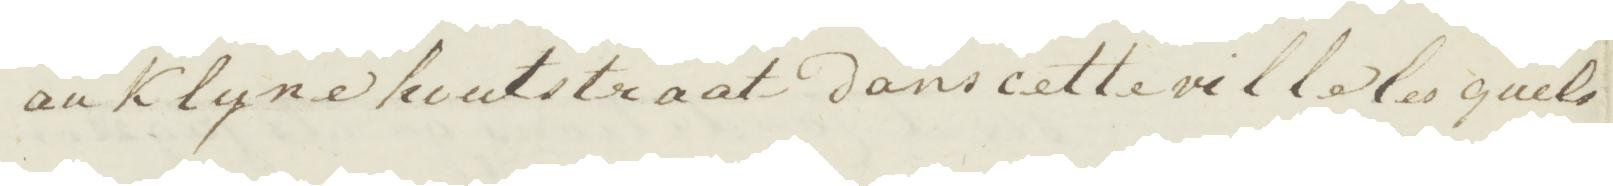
au klyne houtstraat dans cette ville les quels
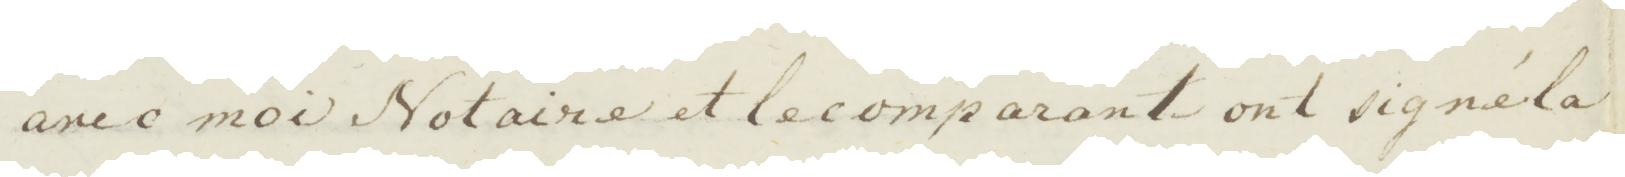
avec moi Notaire et le comparant ont signéla
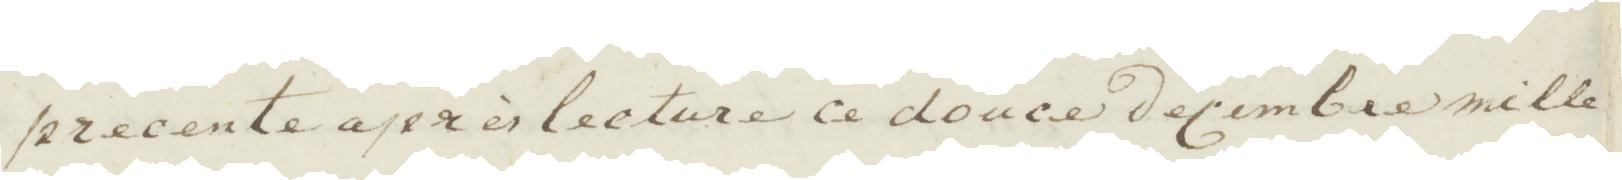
precente après lecture ce douce decembre mille
